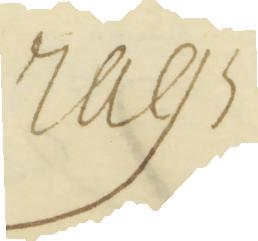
7495
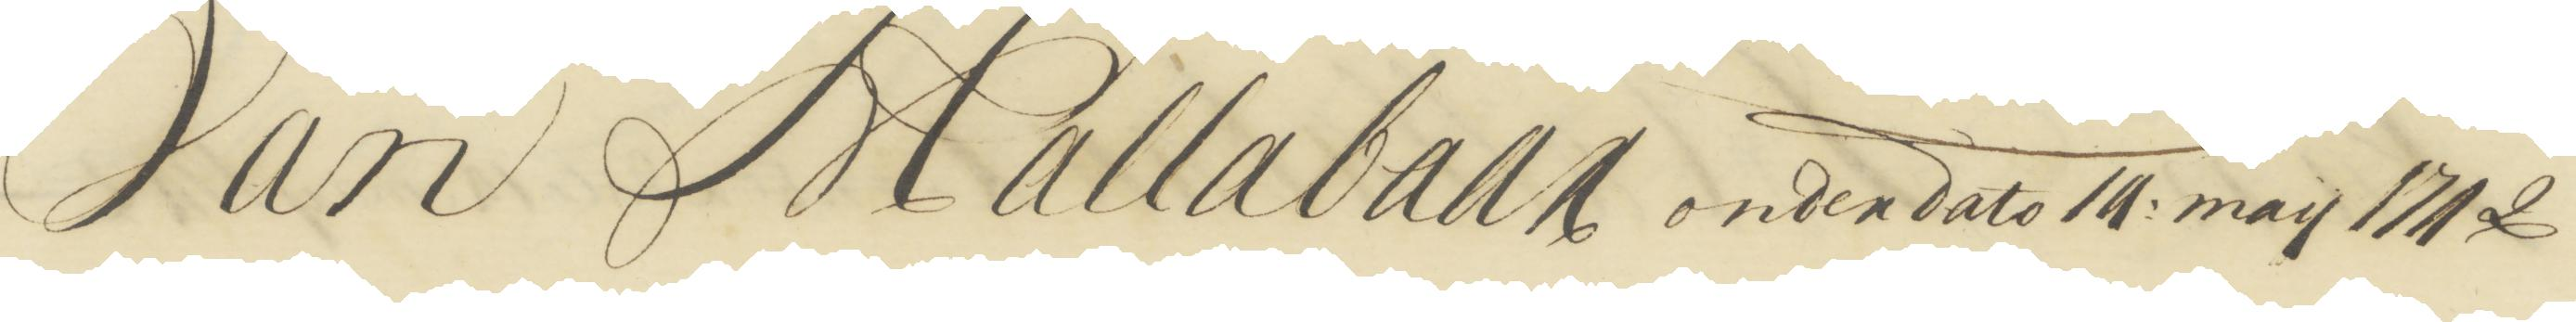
Van Mallabaar onder dato 14: maij 1742
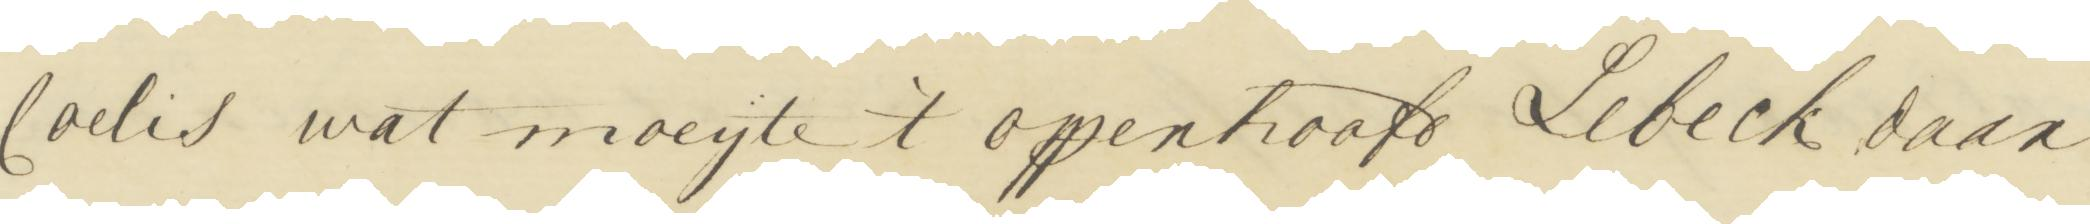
Coelis wat moeijte ’t opperhoofd Lebeck daar
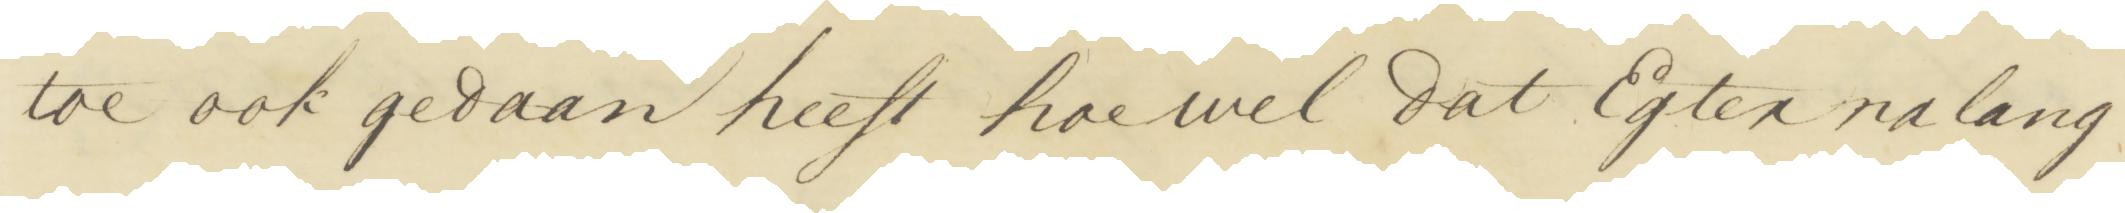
toe ook gedaan heeft hoe wel dat Egter nalang
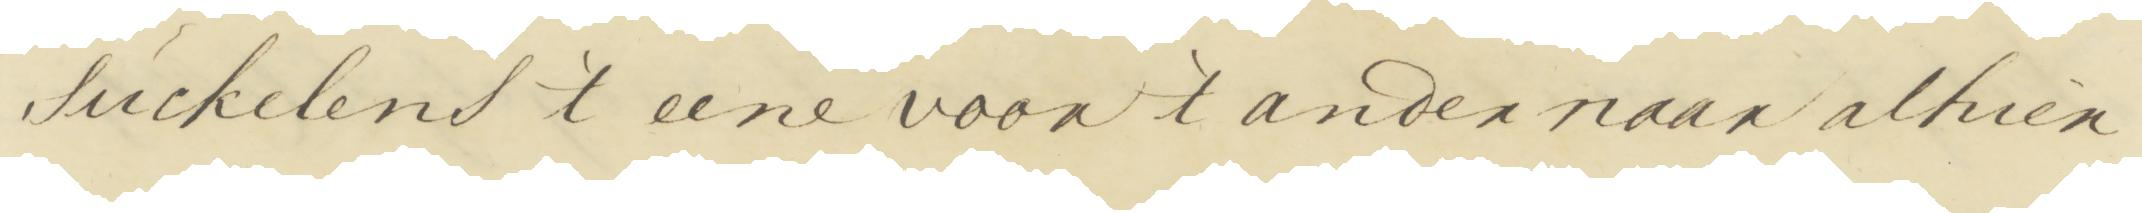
suckelens ’t eene voor ’t ander naar alhier
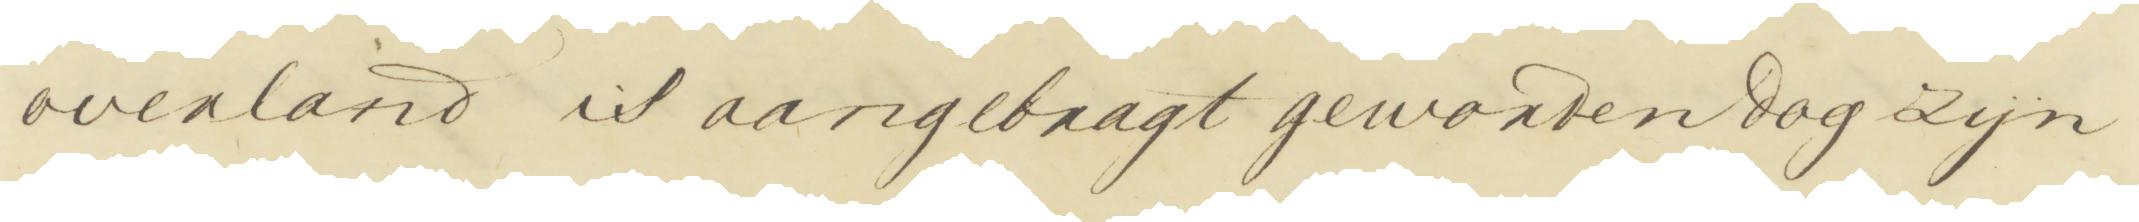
overland is aangebragt geworden dog zijn
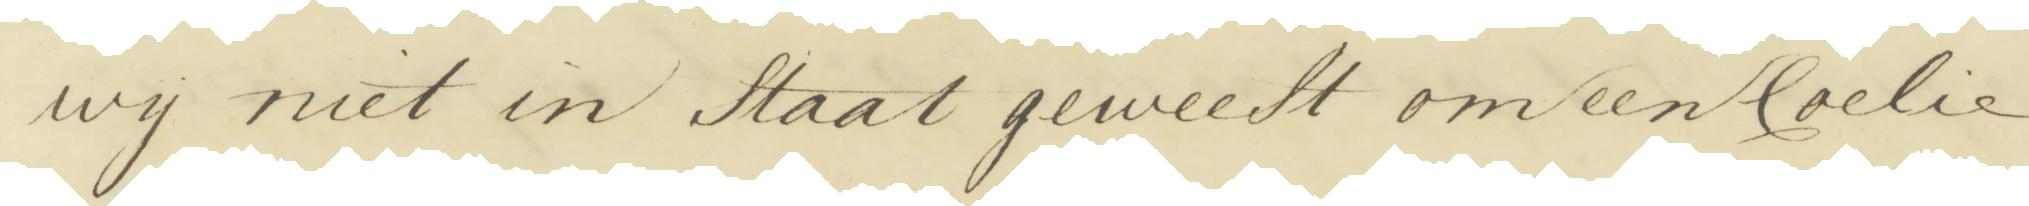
wij niet in staat geweest om een Coelie
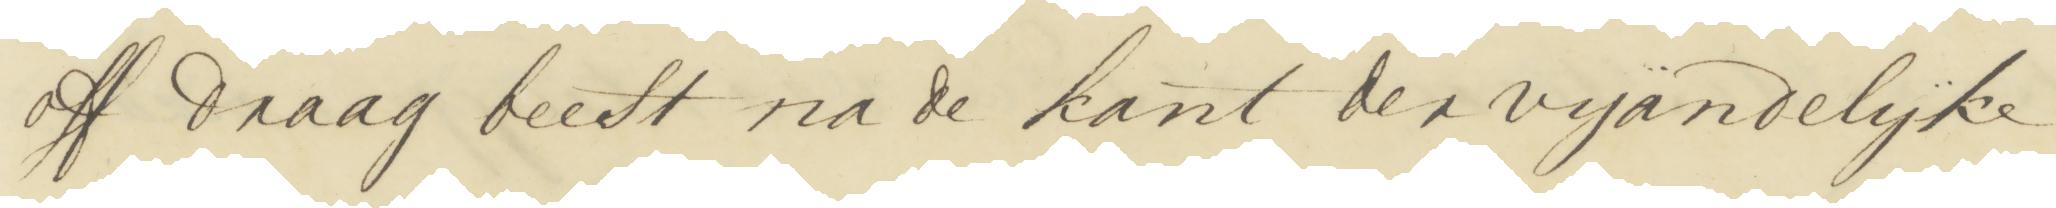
off draag beest na de kant der vijandelijke
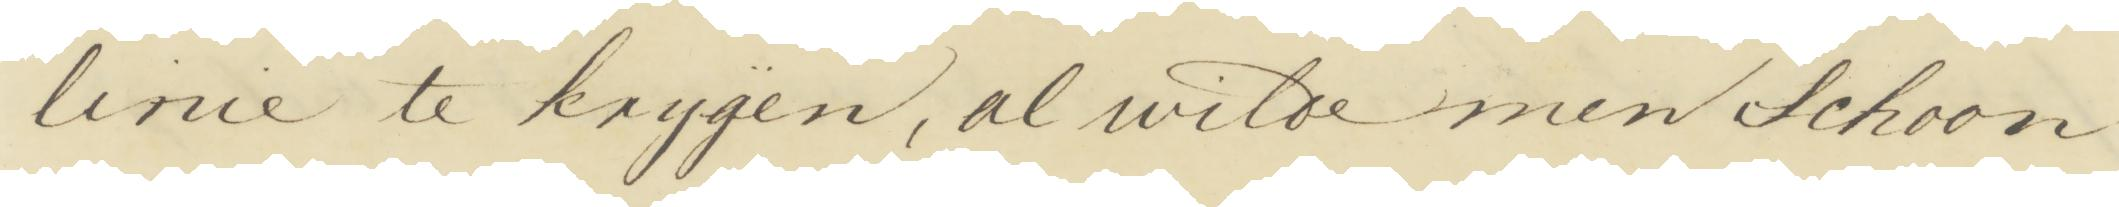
linie te krijgen, al wilde men schoon
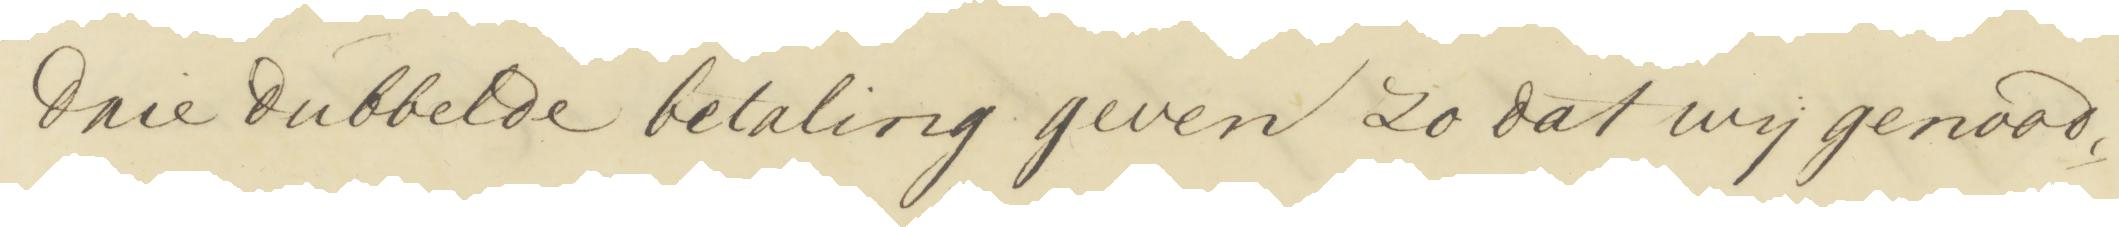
drie dubbelde betaling geven zo dat wij genood„
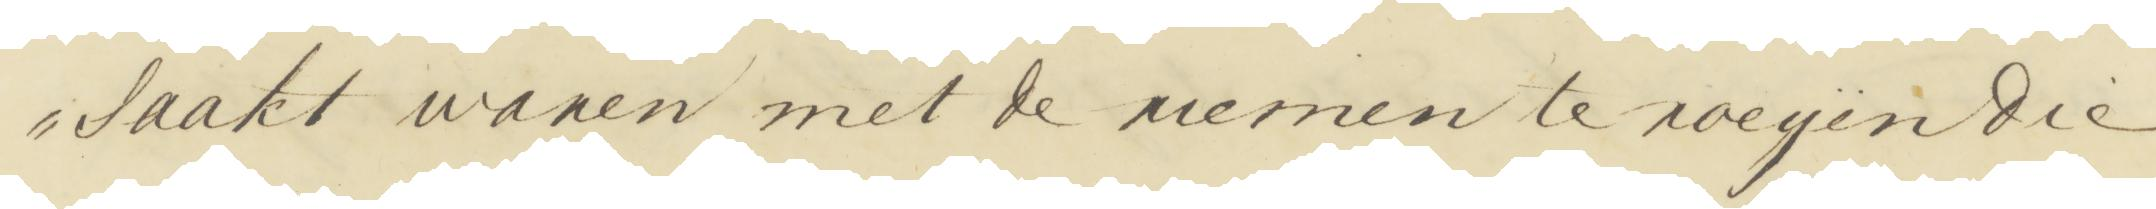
„saakt waren met de riemen te roeijen die
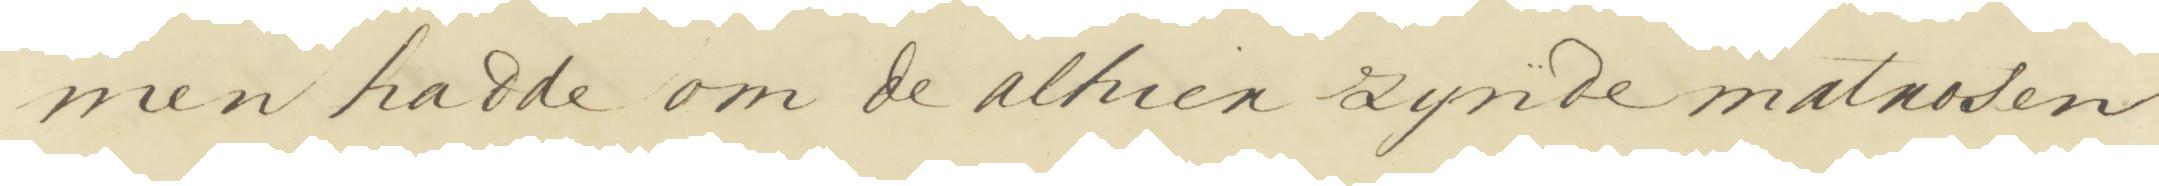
men hadde om de alhier zijnde matrosen
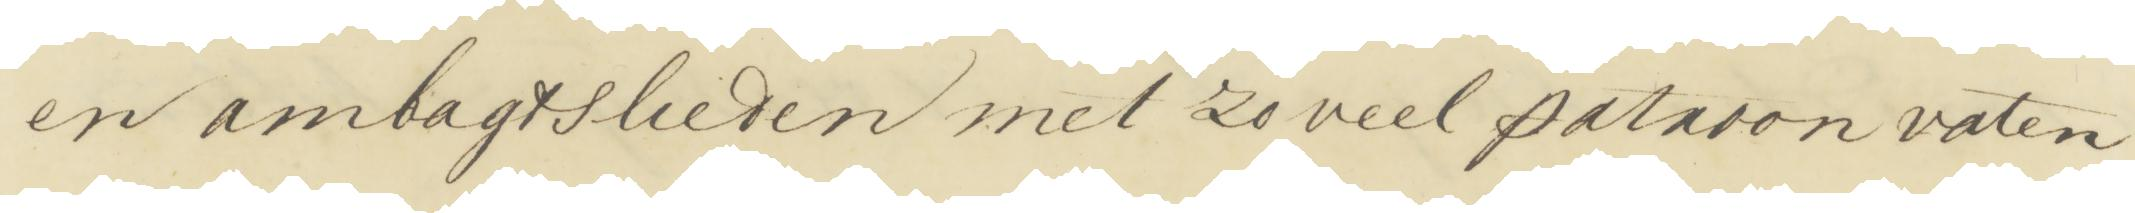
en ambagtslieden met zo veel patroon vaten
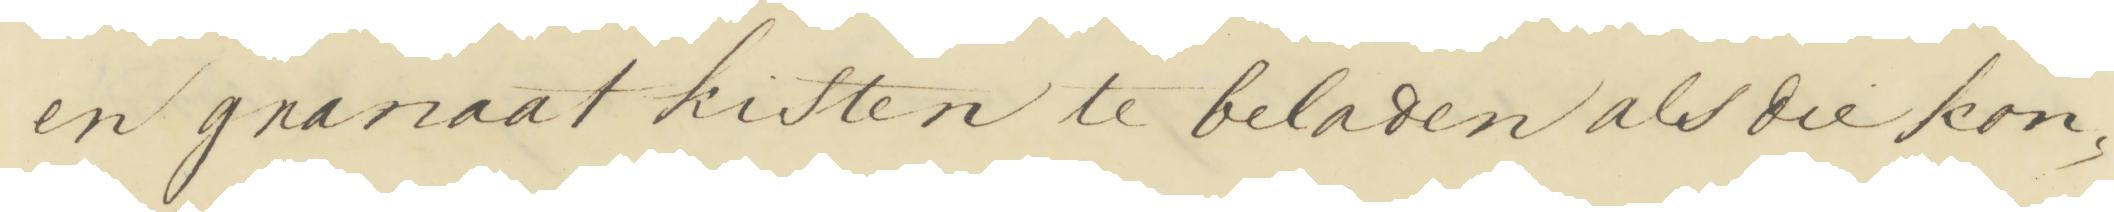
en granaat kisten te beladen als die kon„
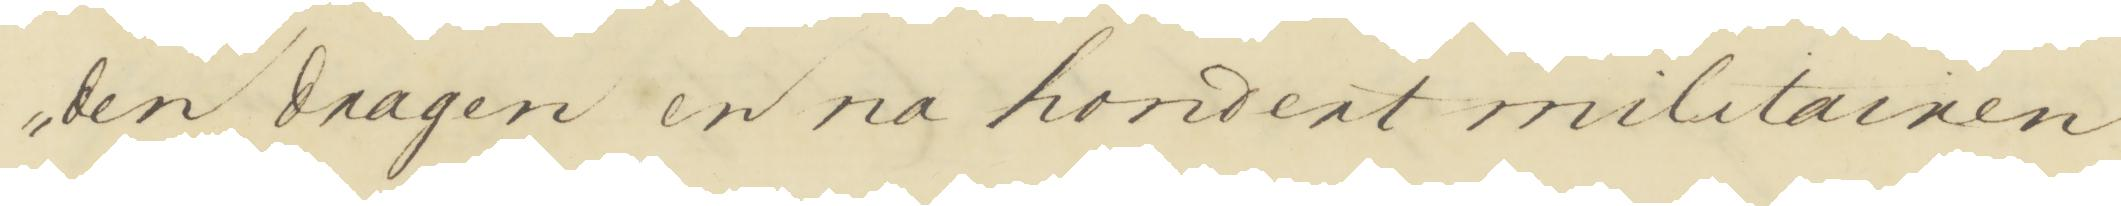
„den dragen en na hondert militairen
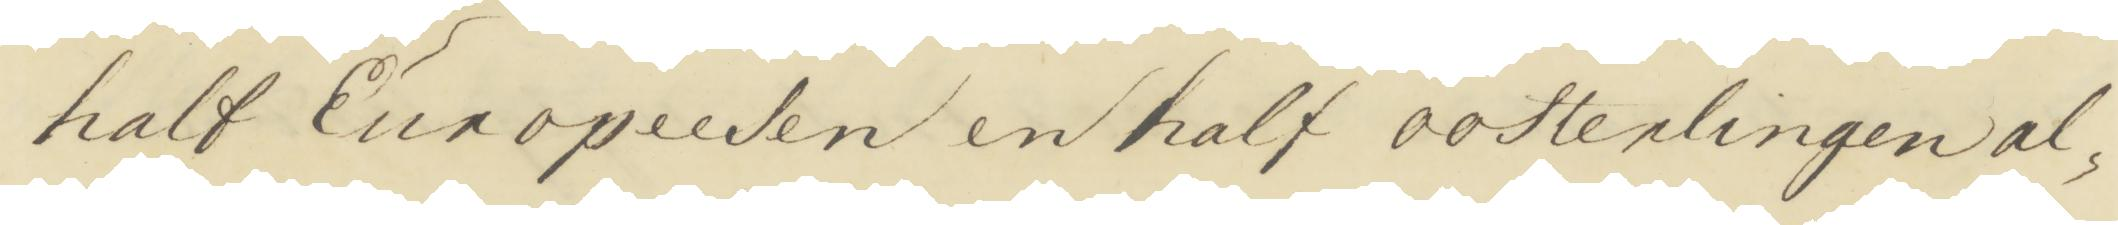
half Europeesen en half oosterlingen al„
